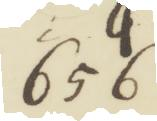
656
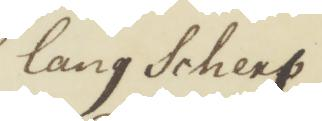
lang scherp
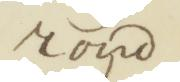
rond
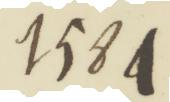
1584
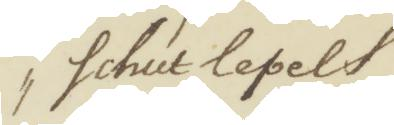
„ schut lepels
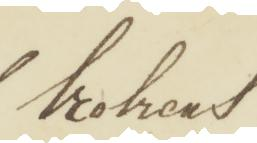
kokers
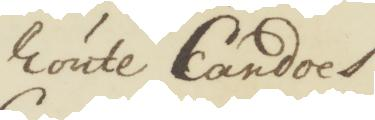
houte Cardoes
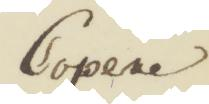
Copere
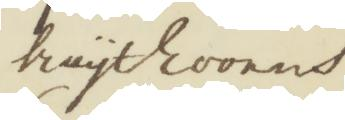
kuijthoorns
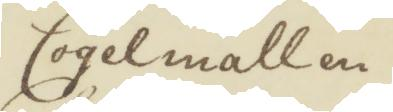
Cogelmallen
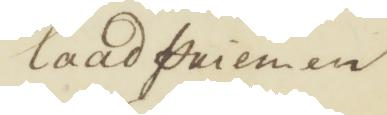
laad prienen
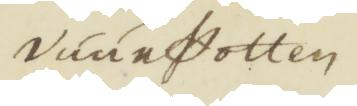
vuurpotten
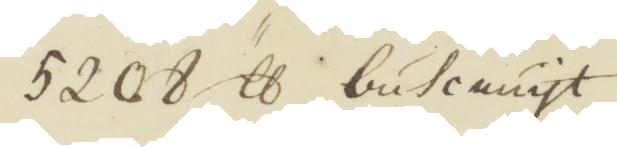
5208 lb buscruijt
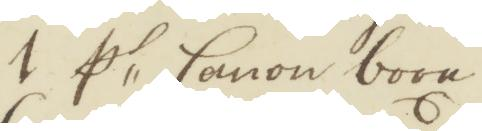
1 p„s canon boor
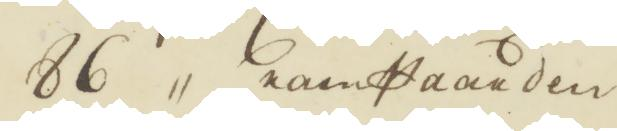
86 „ rampaarden
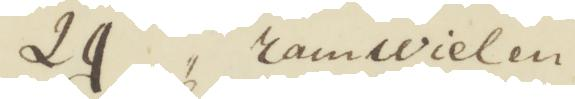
24 „ ramwielen
